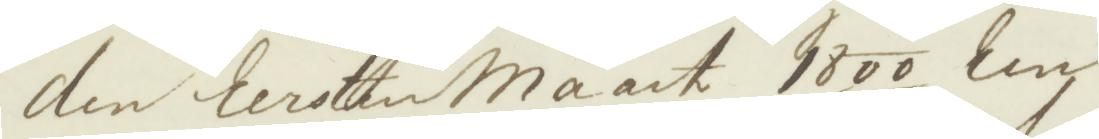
den Eersten Maart 1800 Een
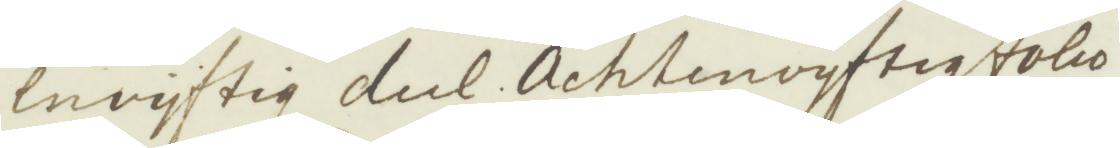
envijftig deel. achtenvyftig folio
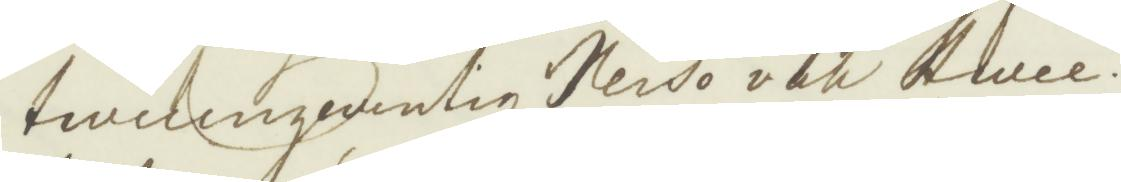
tweeenzeventig Verso vak twee
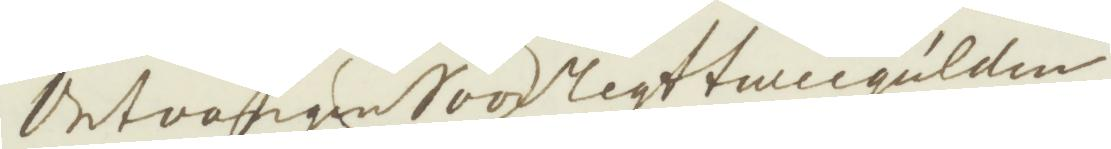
Ontvangen Voor regt twee gulden
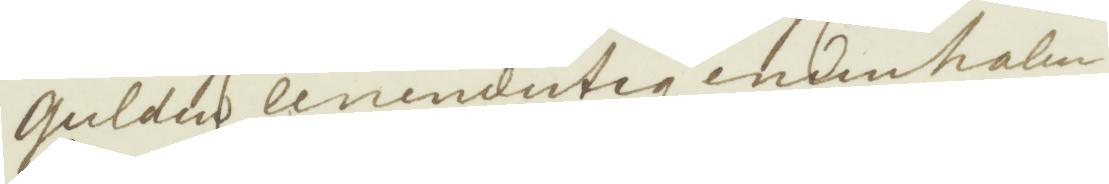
gulden eenendertig enden halve
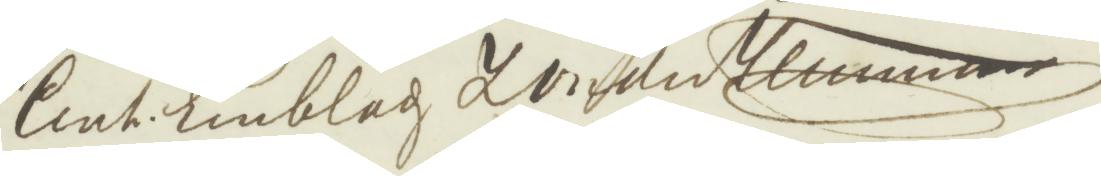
Cent Eenblad Zonder renvooien
